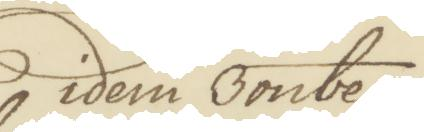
idem 3 onbeq:
